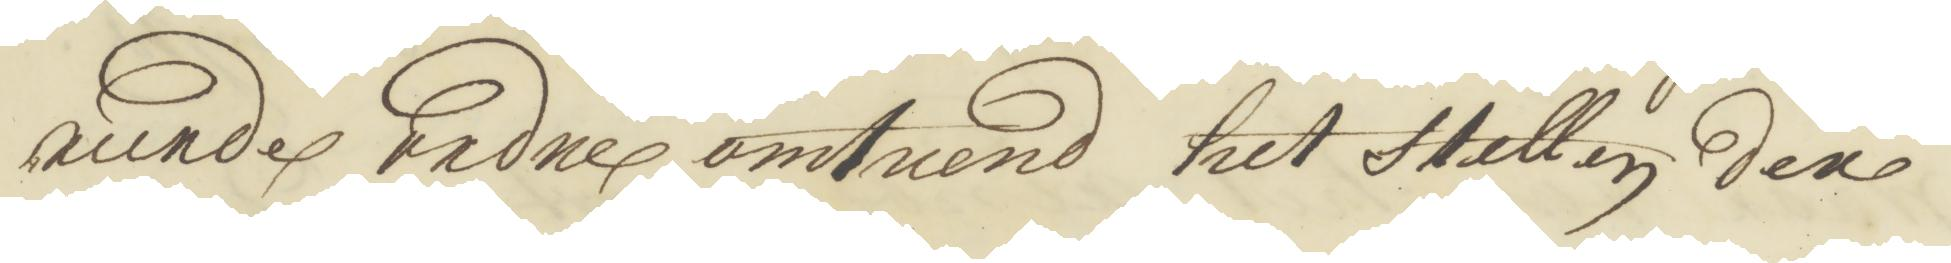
„reerde ordre, omtrend het stellen der
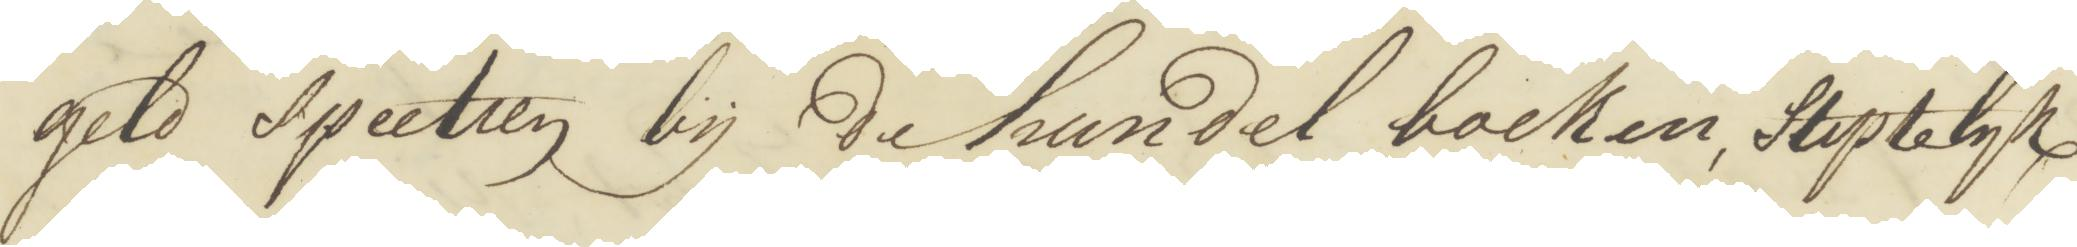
geld speetien bij de handel boeken, stiptelyk
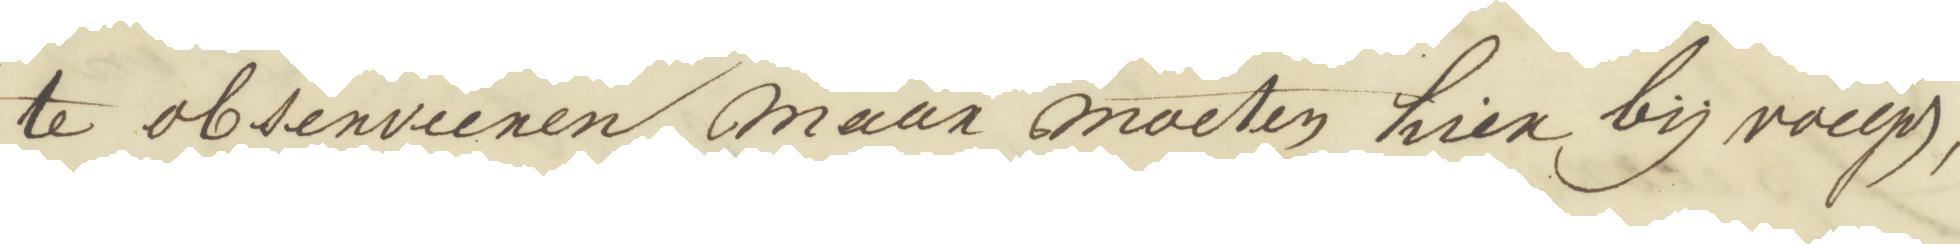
te observeeren, maar moeten hier bij voegen,
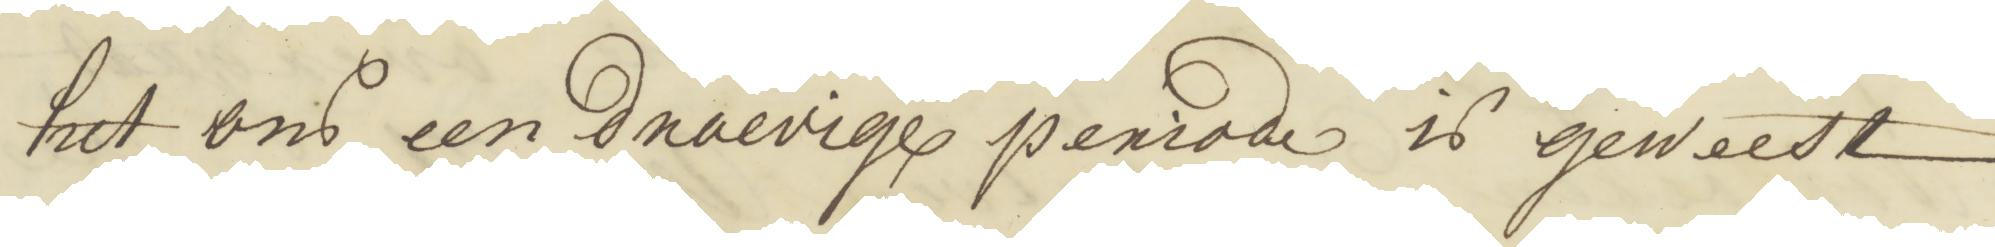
het ons een droevige periode is geweest
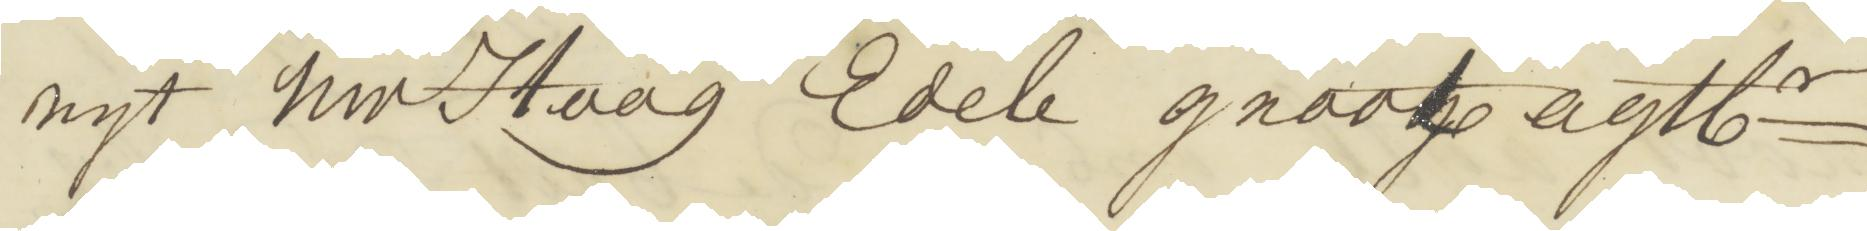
uyt uw Hoog Edele groot agtb=r
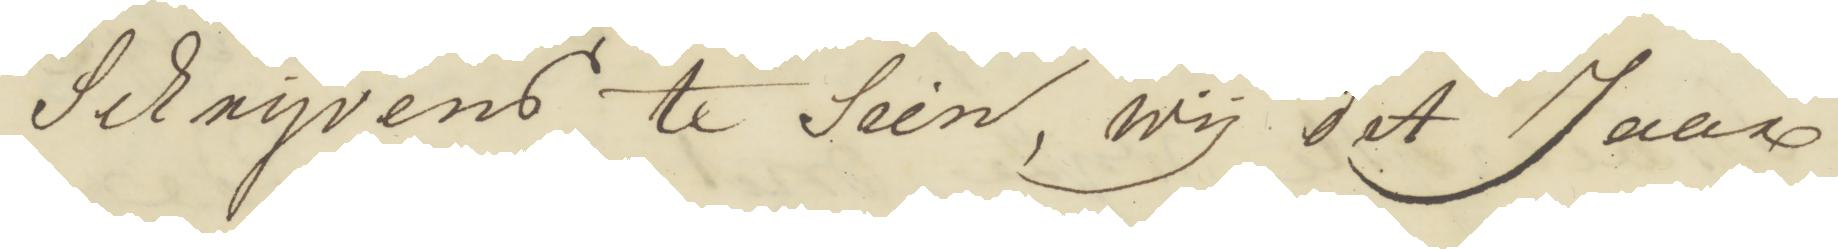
schrijvens te sien, wij dit Jaar
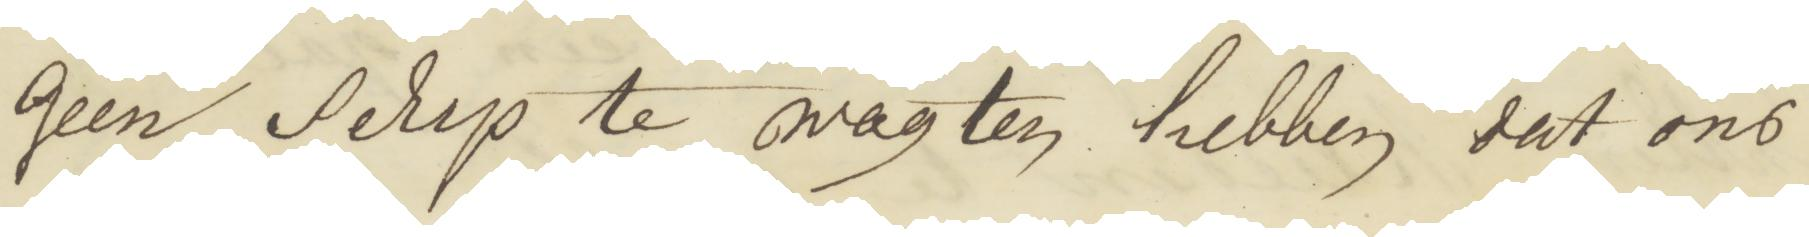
Geen schip te wagten hebben dat ons
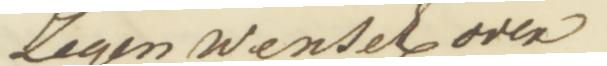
zegen wensch over
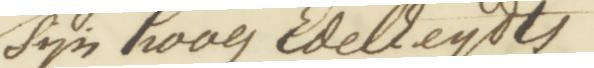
sijn hoog Edelheydts
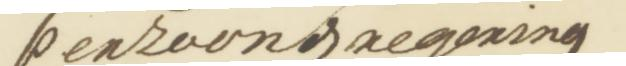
perzoon en regering
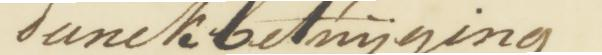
danck betuijging
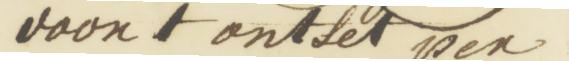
voor t ontset per
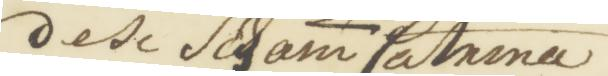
dese Susann Catrina
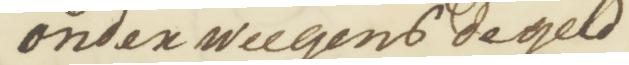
onder weegens degeld
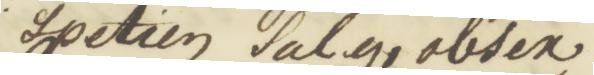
spetien sal g, obser,
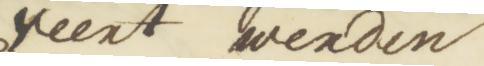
veert werden
